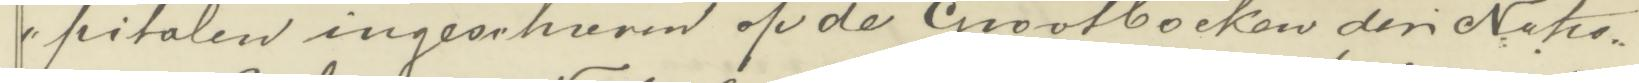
„pitalen ingeschreven op de Grootboeken der Natio„
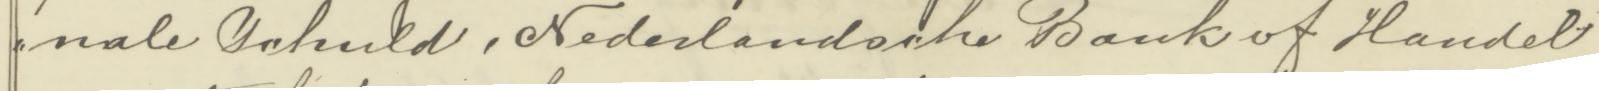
„nale schuld, Nederlandsche Bank of Handels
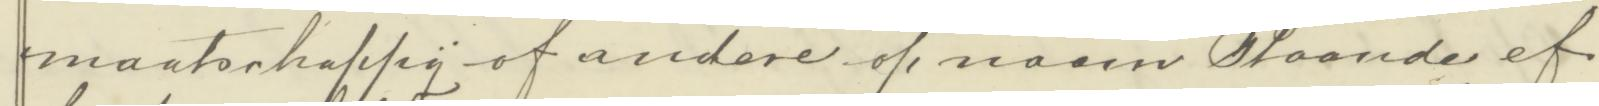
„maatschappij of andere op naam staande ef.
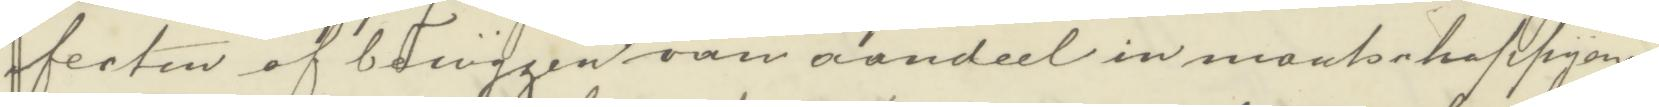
„fecten of bewijzen van aandeel in maatschappijen
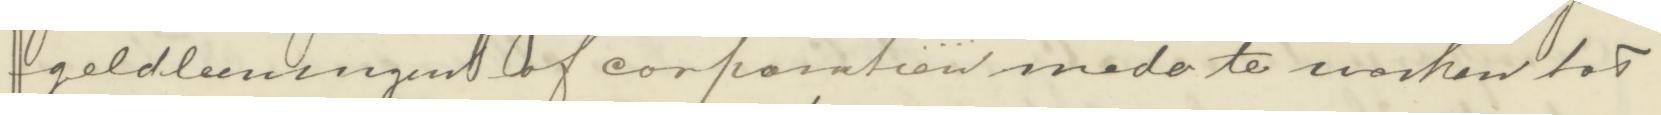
geldleeningen of corporatiën mede te werken tot
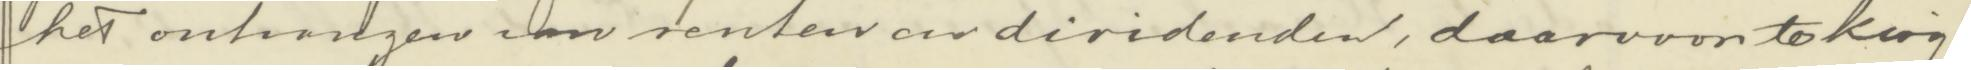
het ontvangen van renten en dvidenden, daarvoor te kwij
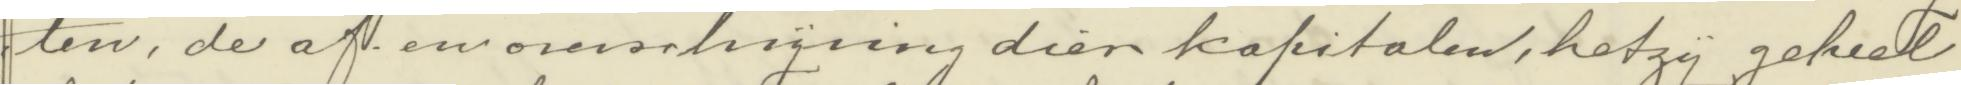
ten, de af en overschrijving dier kapitalen, hetzij geheel,
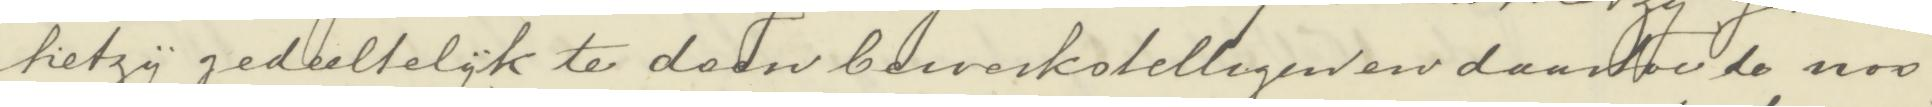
hetzij gedeeltelijk te doen bewerkstelligen en daartoe de noo
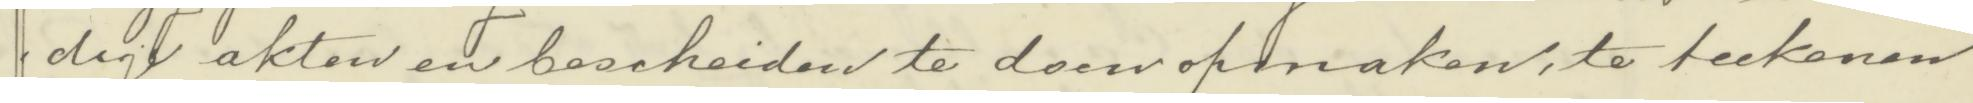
„dige akten en bescheiden te doen opmaken, te teekenen
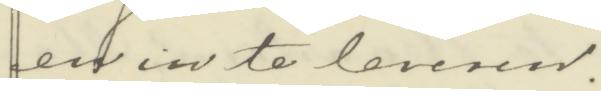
en in te leveren.
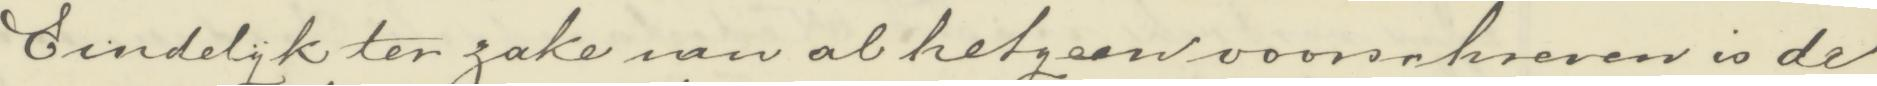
Eindelijk ter zake van al hetgeen voorschreven is de
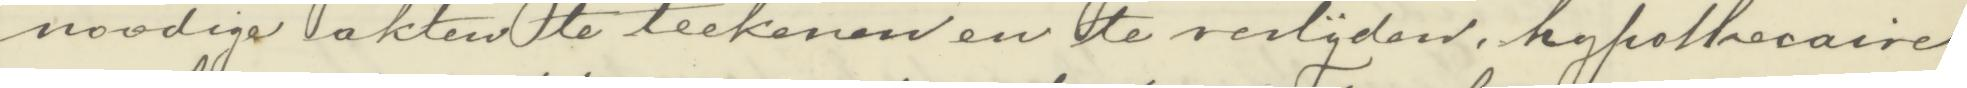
noodige akten te teekenen en te verlijden, hypothecaire
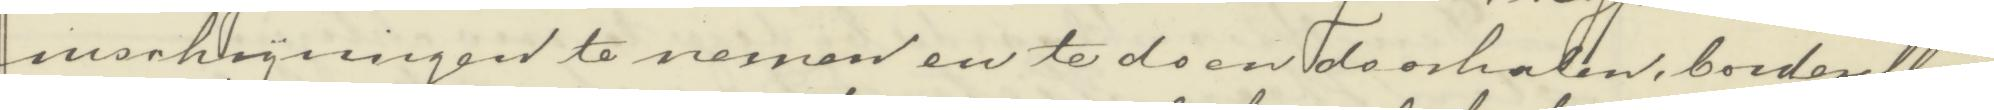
inschrijvingen te nemen en te doen doorhalen, borderellen
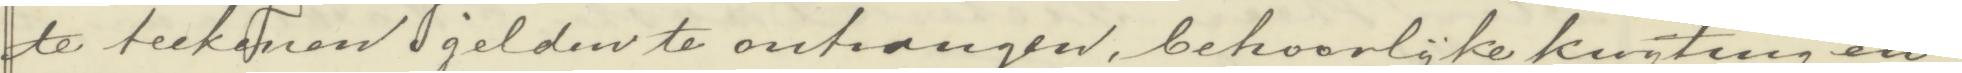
te teekenen, gelden te ontvangen, behoorlijke kwijting en
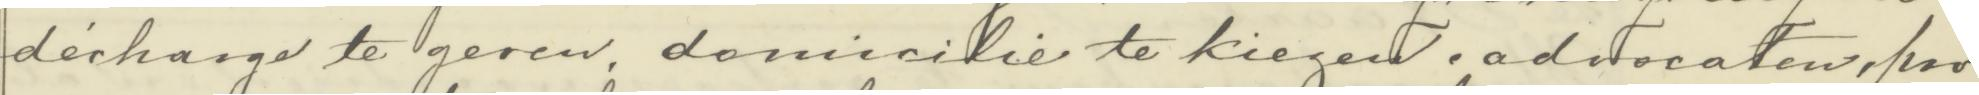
décharge te geven, domicilie te kiezen, advocaten, pro
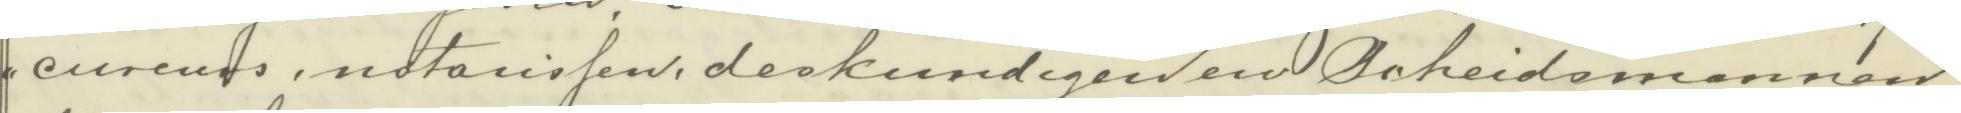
„cureurs, notarissen, deskundigen en scheidsmannen
